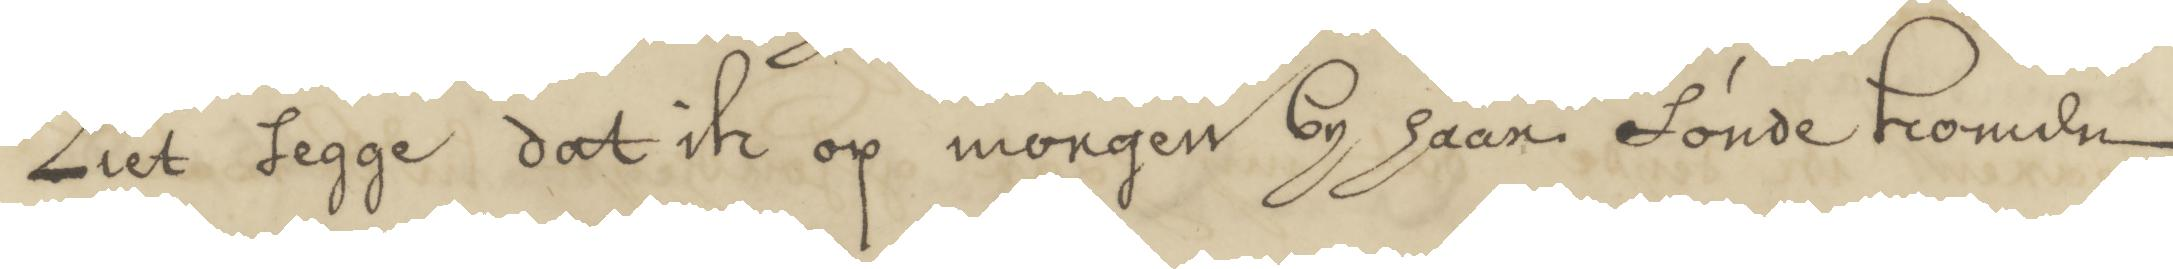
Liet segge dat ik op morgen by haar Soude komen,
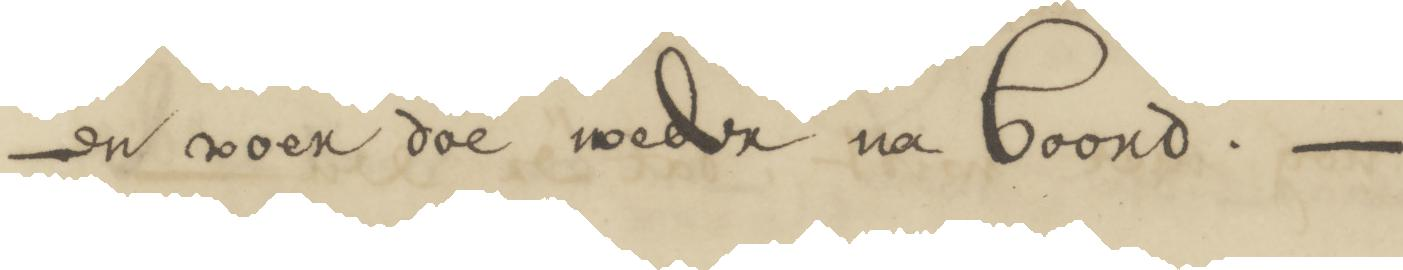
en voer doe weder na boord.
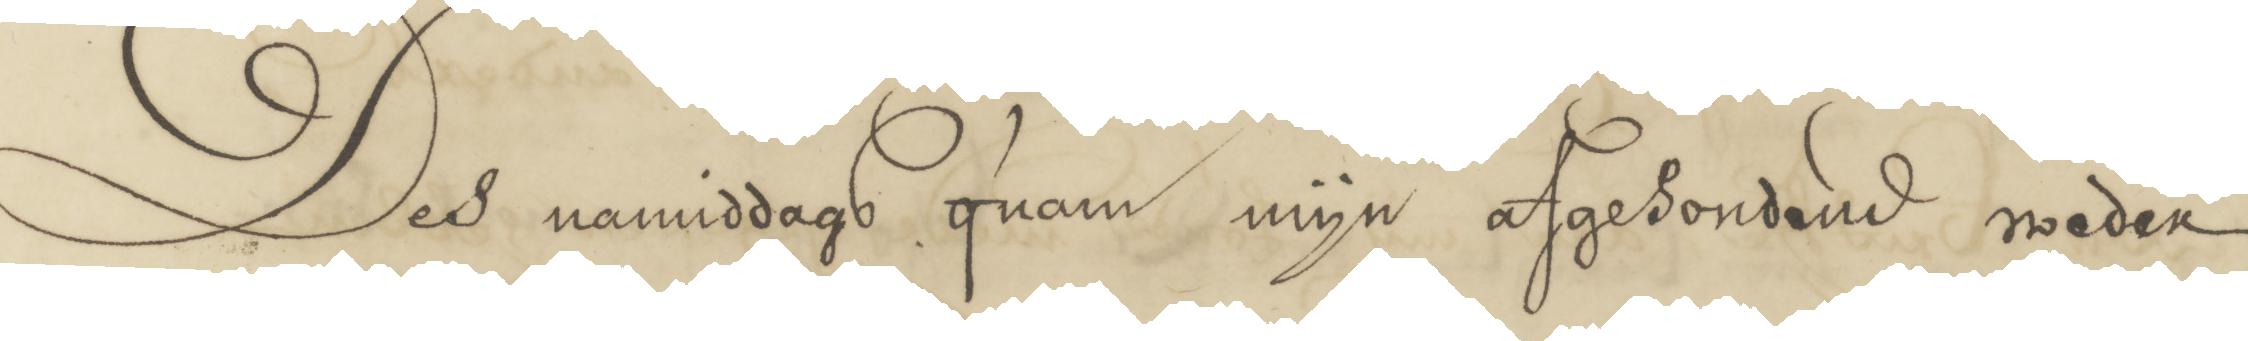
Des namiddags quam mijn afgesondene weder
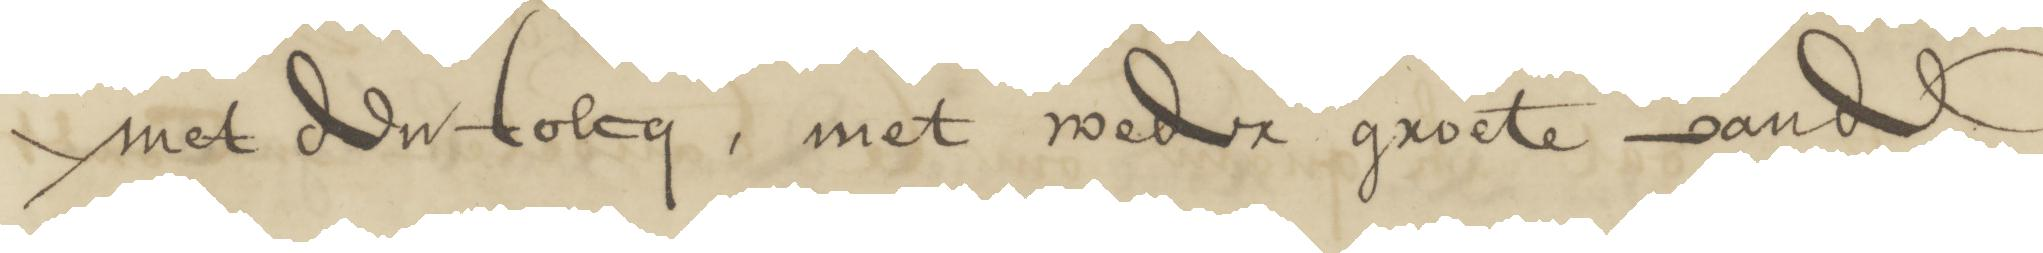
met den tolcq, met weder groete vande
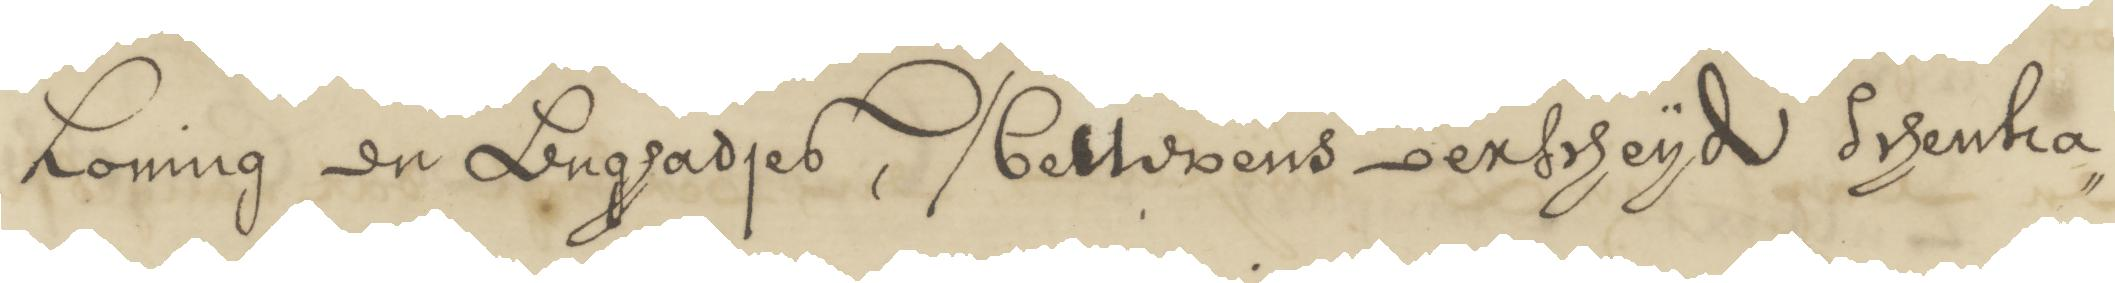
koning en Senghadjes, /bettevens verscheijde schenka„
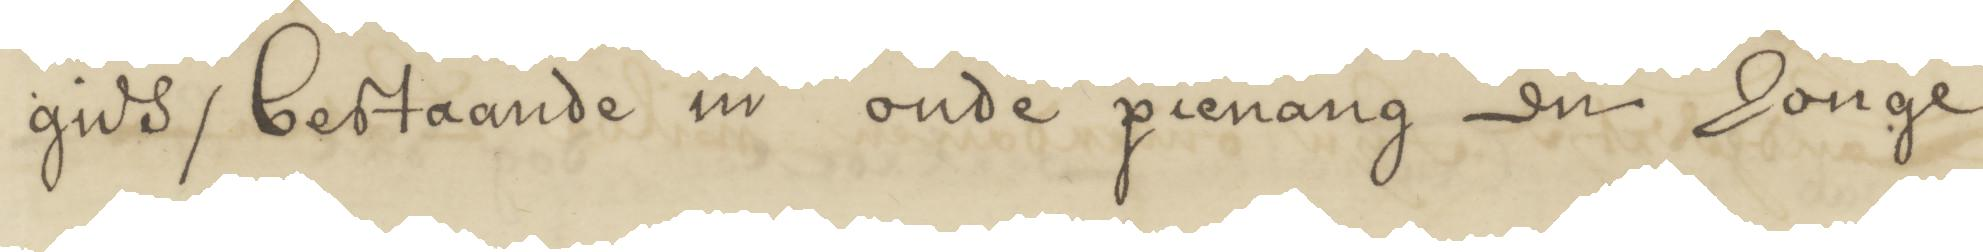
gies / bestaande in oude pienang en Jonge
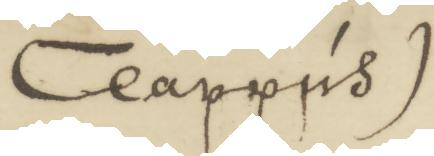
Clappus)
